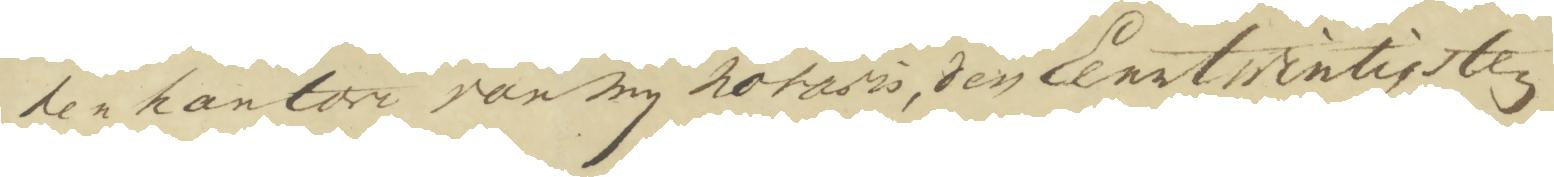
ten kantore van my notaris, den Eenentwintigste
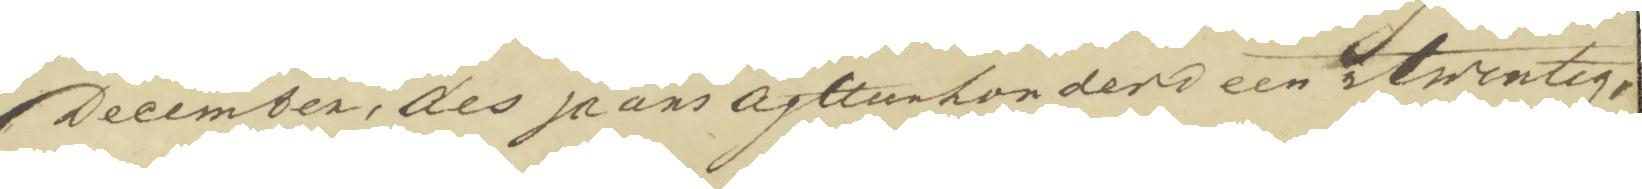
december, des jaars agttienhonderd een en twintig
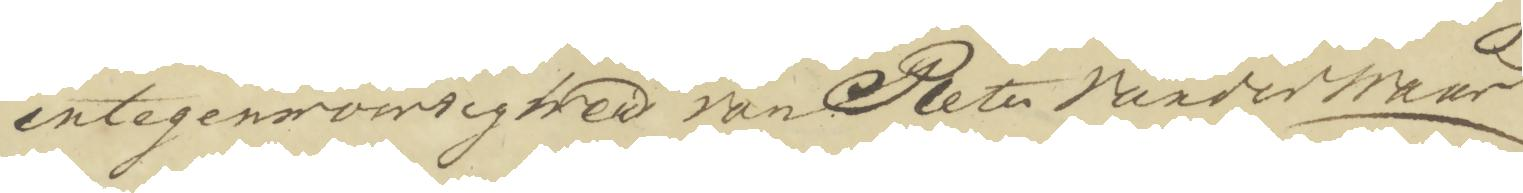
in tegenwoordigheid van Pieter vander waar
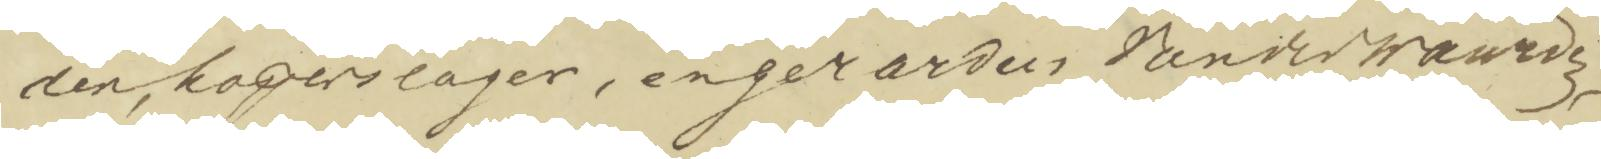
den, koperslager, en gerardus vender waarden,
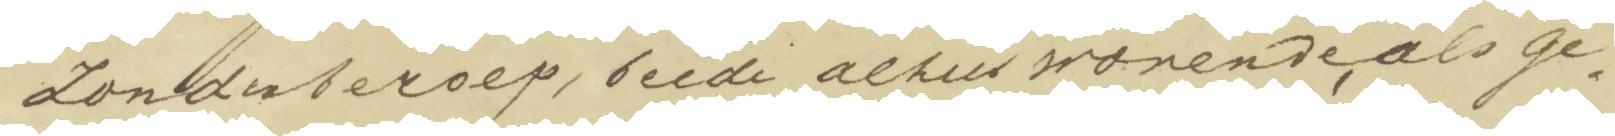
zonder beroep, beide alhier wonende als ge„
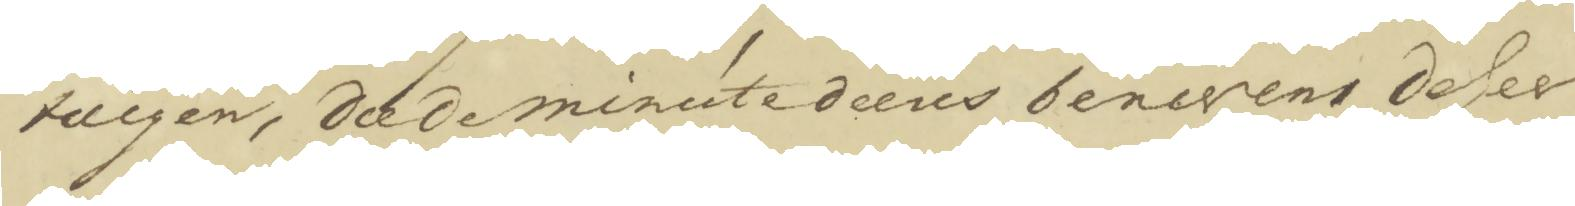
tuigen, die de minute deeses benevens deses
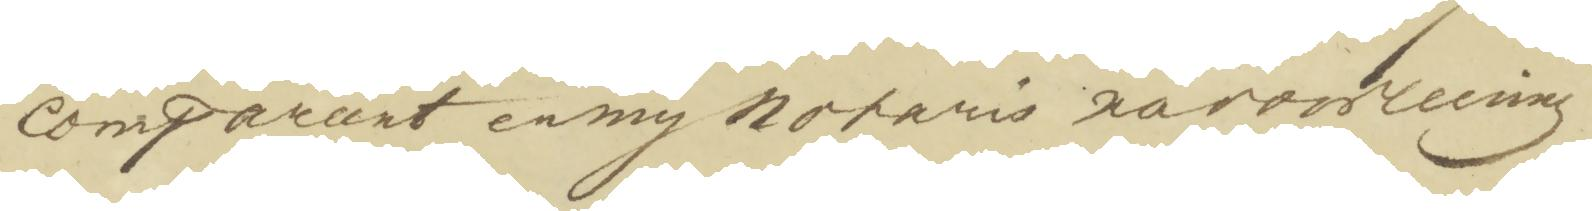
compareert en my notaris na voorleesing
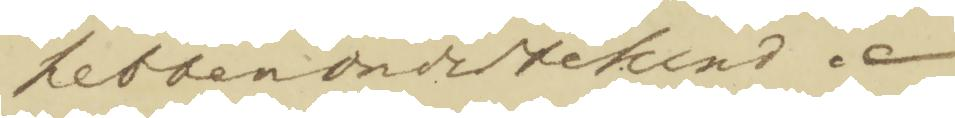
hebben ondertekend.
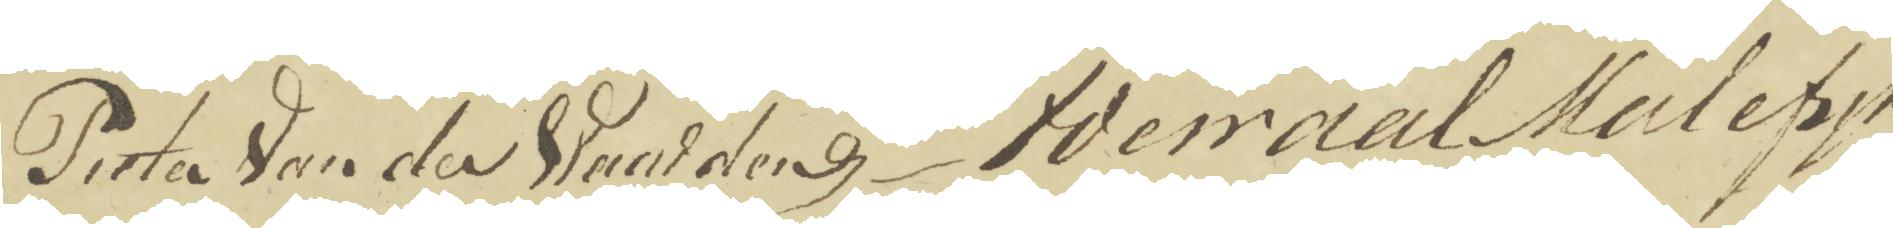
Pieter van der Waarden Toemaal Malesch r/s
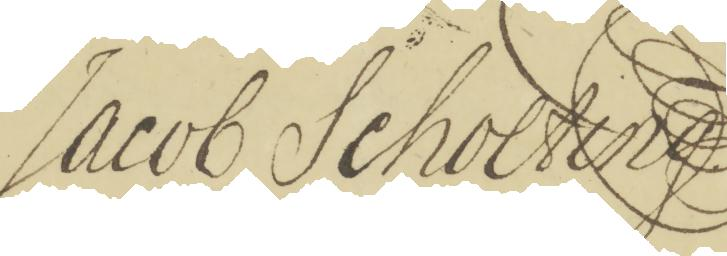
Jacob Scholten
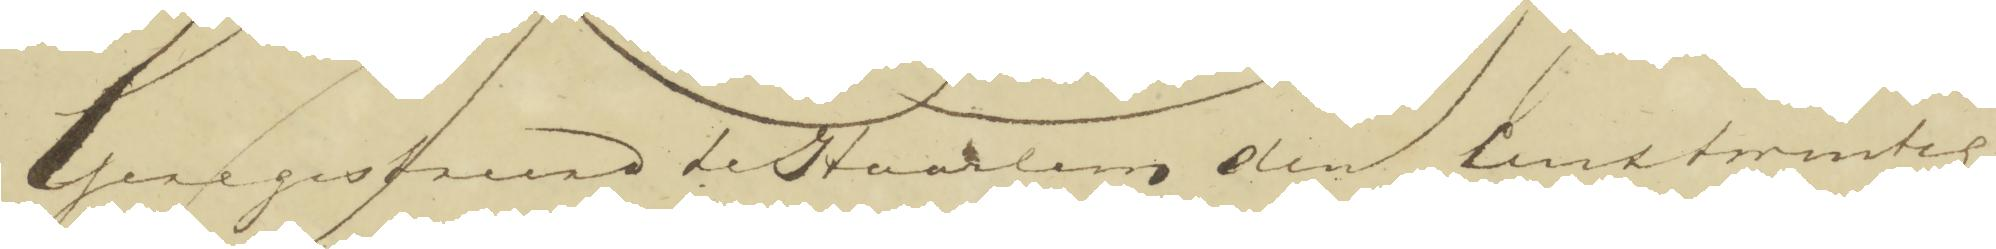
Geregistreerd te Haarlem den Eenentwintig
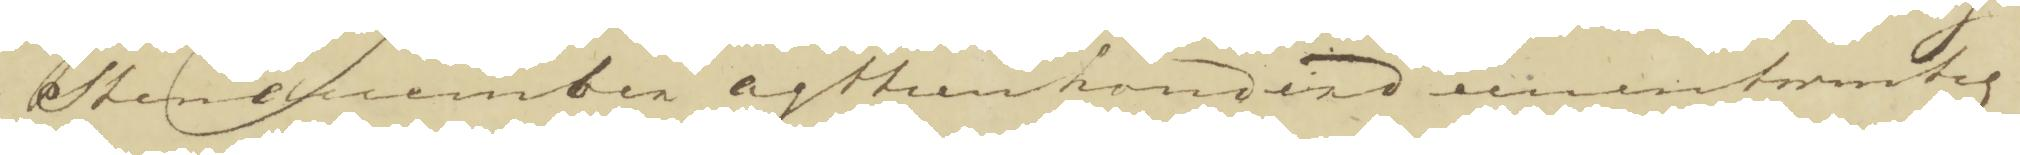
sten december agttienhonderd eenentwintig
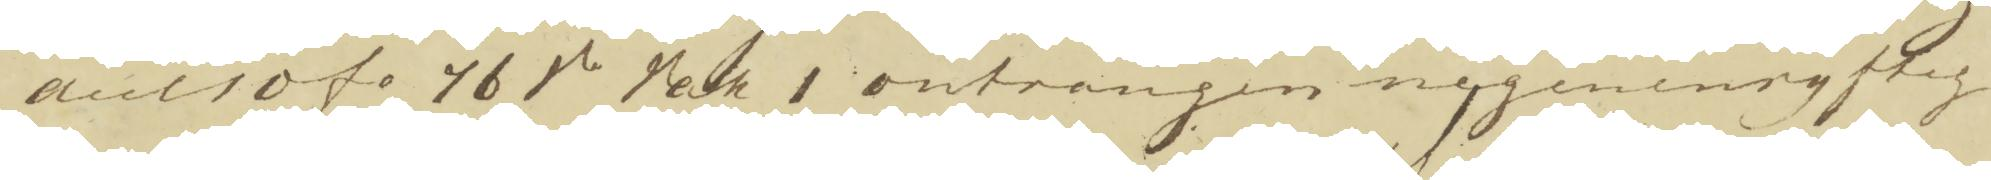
deses 10 fo 76 Vo Van 1 ontvangen negenenvyftig
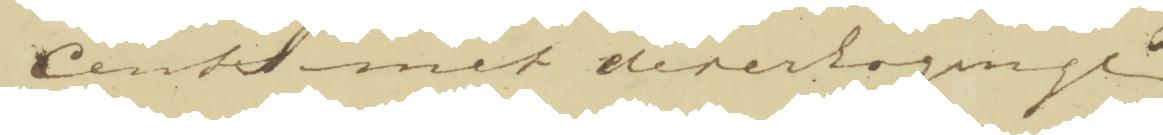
cents met de verhoginge
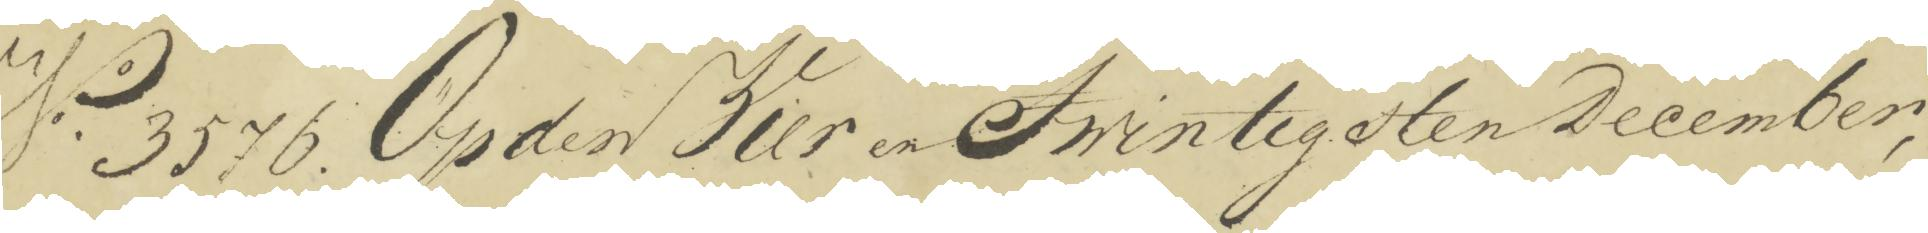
N.o 3376. Op den Vier en Twintigsten December,
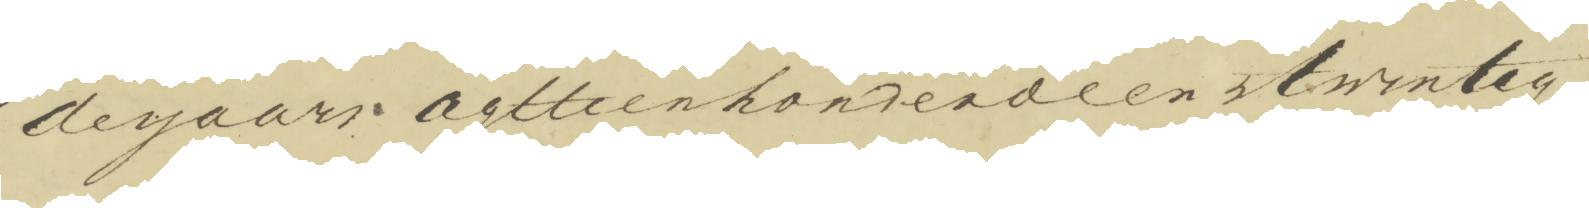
de jaars agttienhonderd een en twintig
